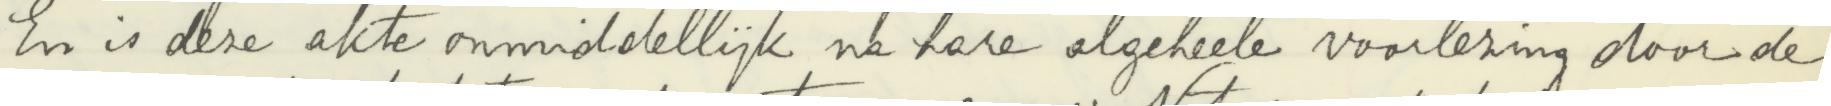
En is deze akte onmiddellijk na hare algeheele voorlezing door de
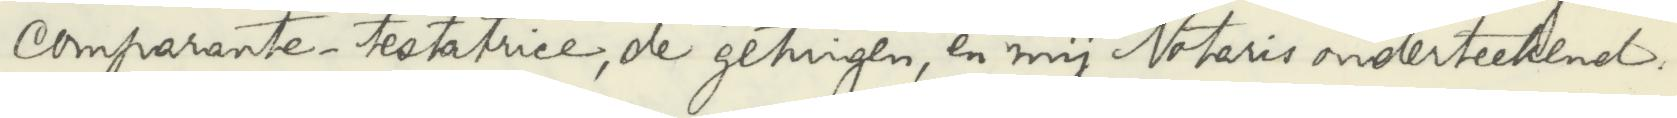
Comparante-testatrice, de getuigen, en mij Notaris onderteekend.
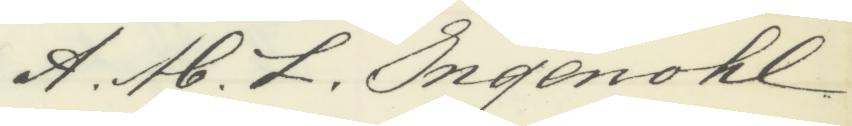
A. H. L. Ingenohl
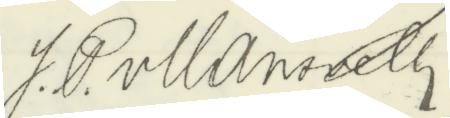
J: P: vMansveld
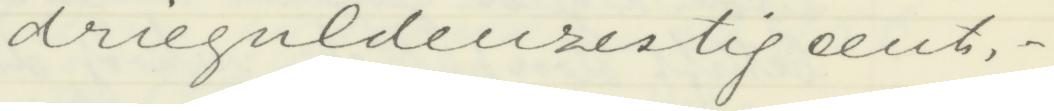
drieguldenzestig cents,-
